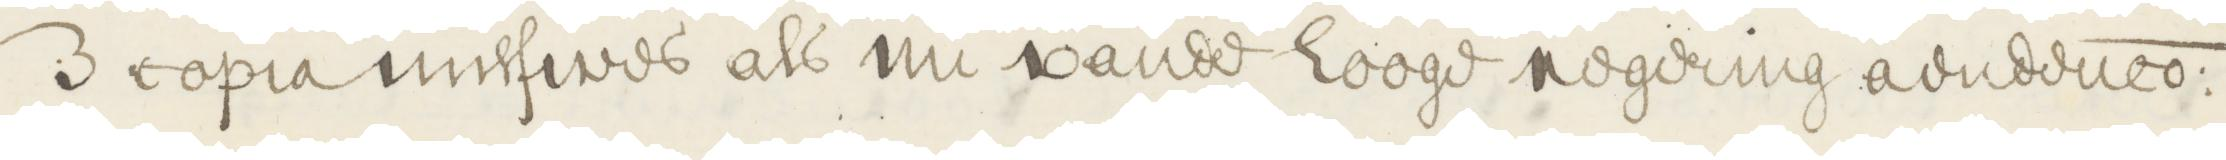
3 copia missives als nu vande hooge regering aen den co:
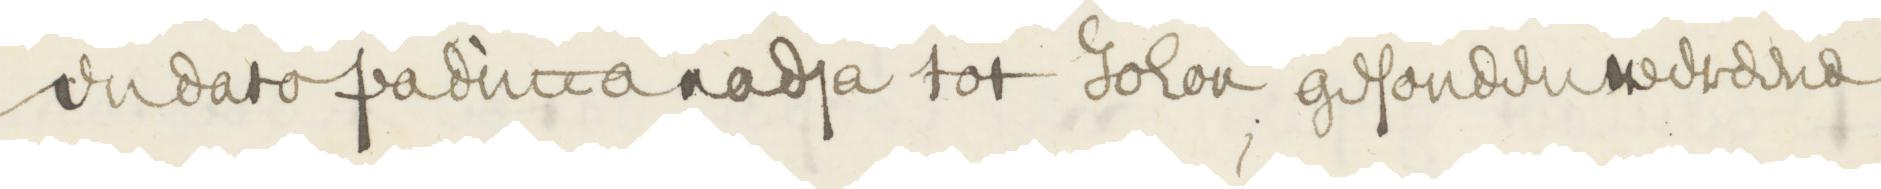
en dato paducca radja tot Johor gesonden werdende
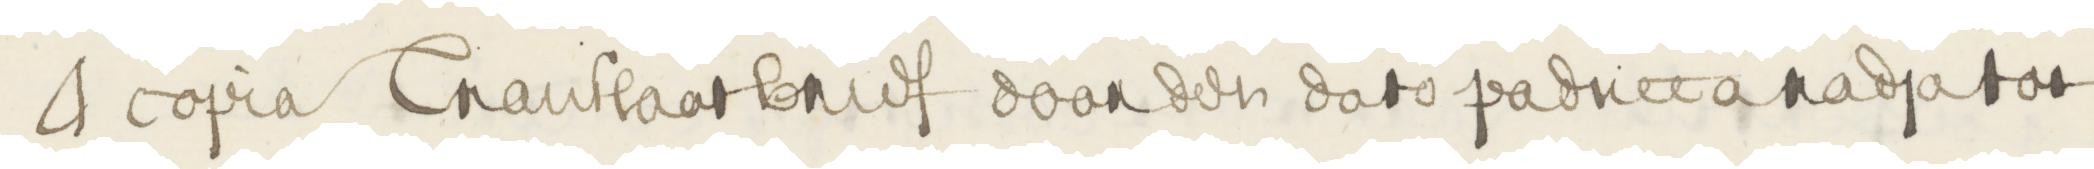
4 copia Translaatbrief door den dato paduccca radja tot
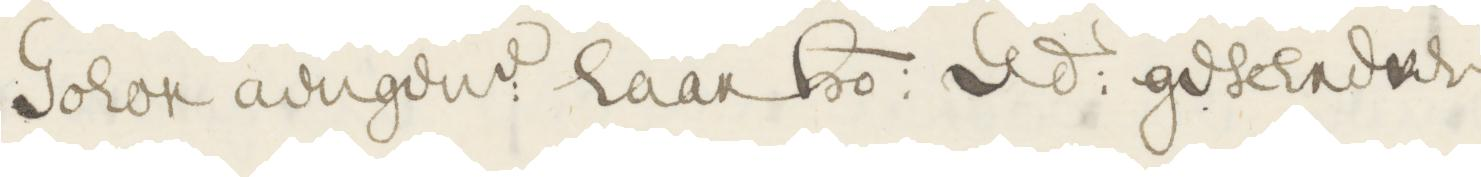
Johor aen gen:e haar ho: Ed:' geschreve
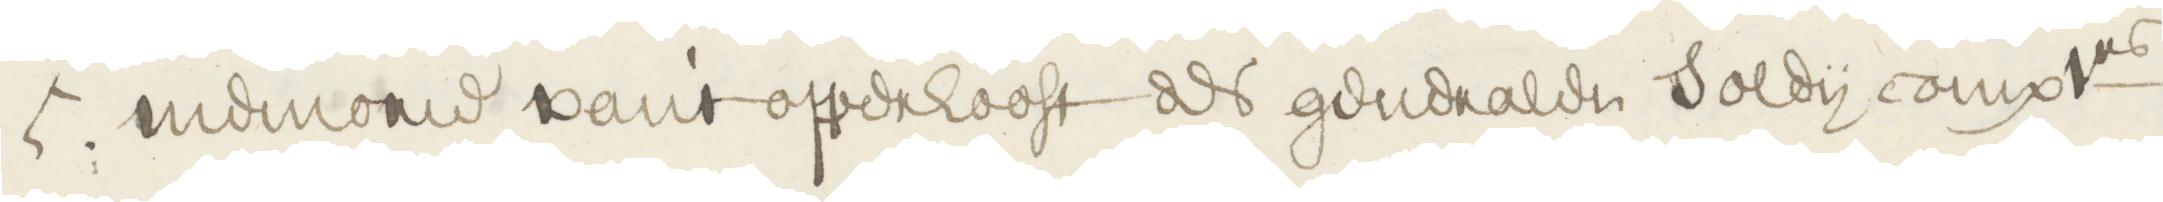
5. memorie van ’t opperhooft des generalen soldij compt:rs
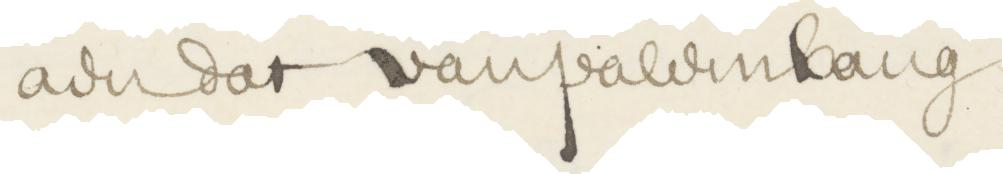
aen dat van palembang
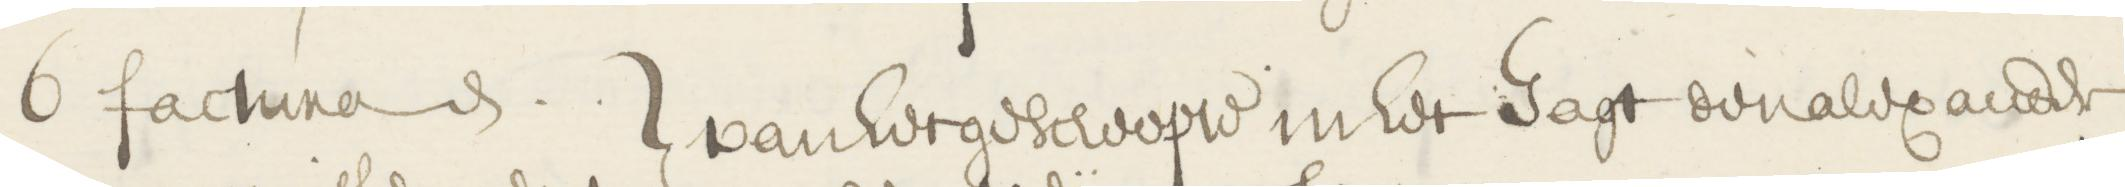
6 factura en. van het gescheepte in het jagt den alexander
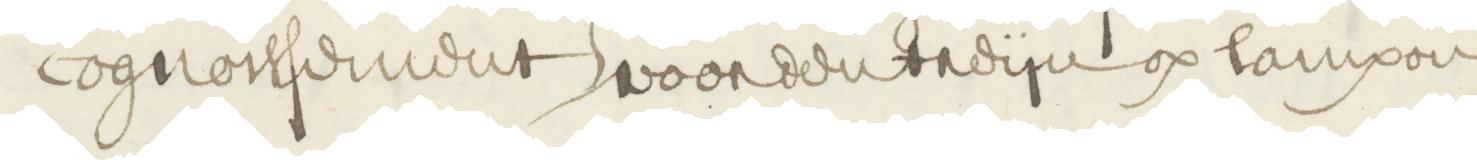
cognoissement voor den treijn op lampon
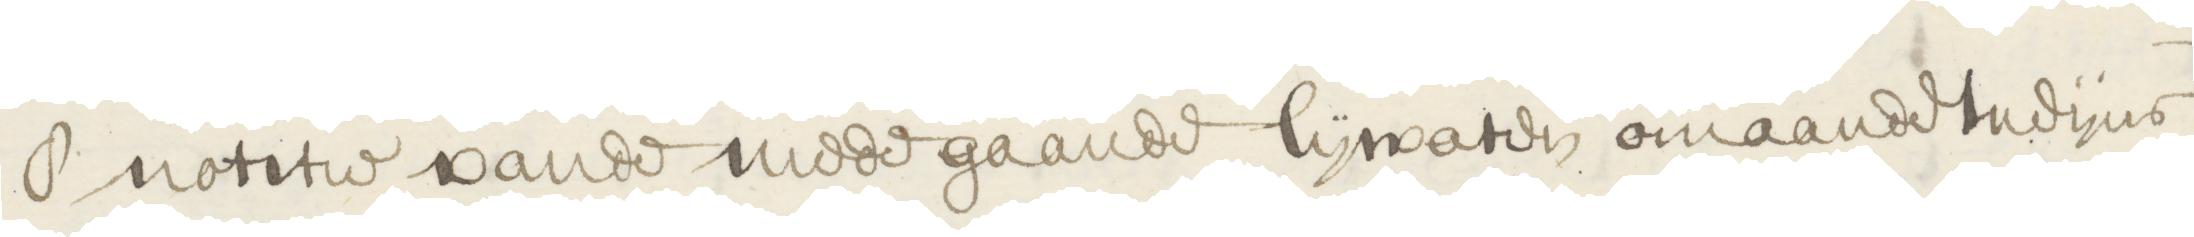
8 notitie van de mede gaande lijwaten om aande treijns
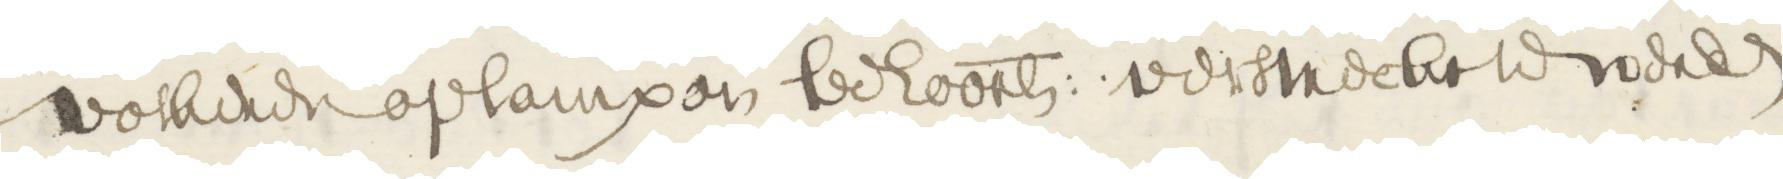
volkeren op lampon behoorlijk verstreckt te werden
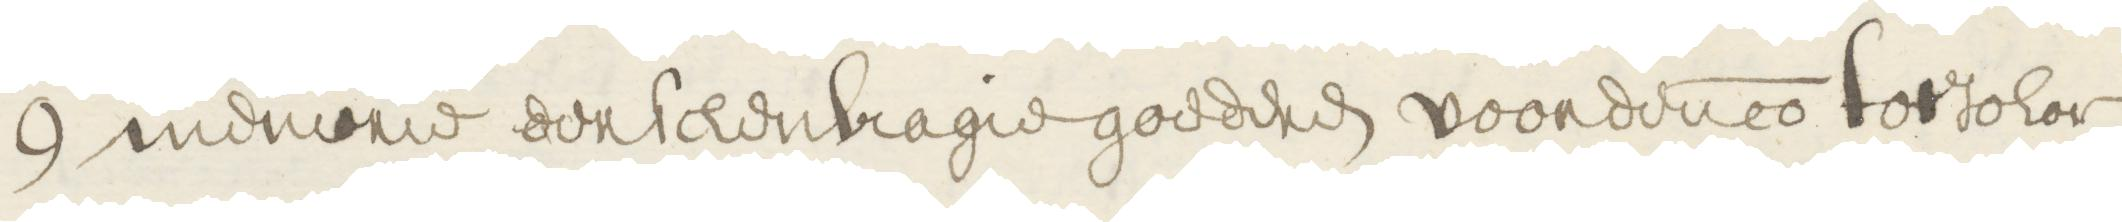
9 memorie der schenkagie goederen voor den co: tot johor
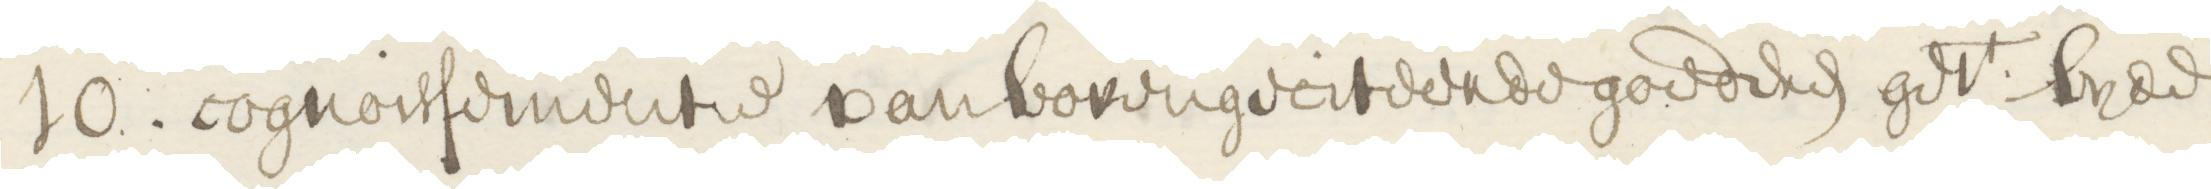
10. cognoissementie van boven geciteerde goederen get:t by de
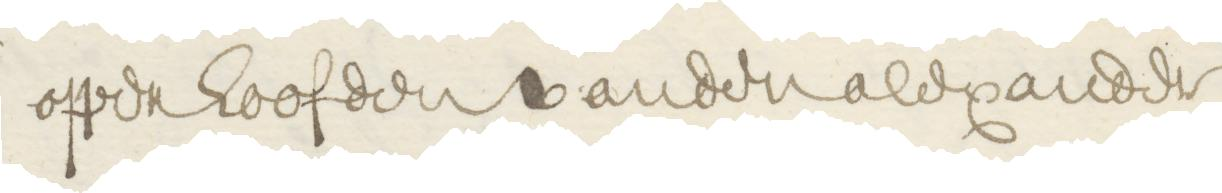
opperhoofden van den alexander
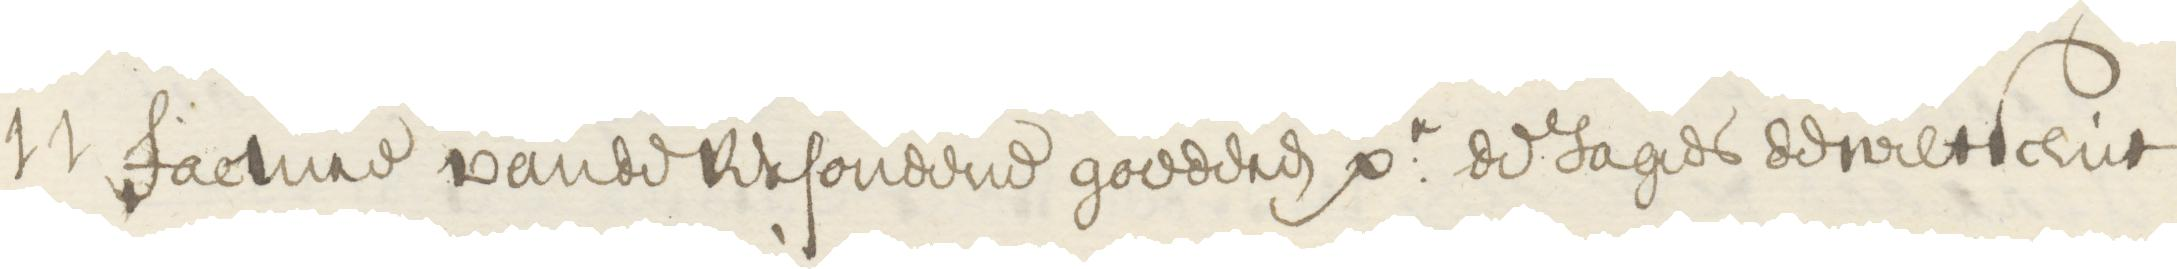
11 facture van de versondene goederen p:r de jagies de wiltschut
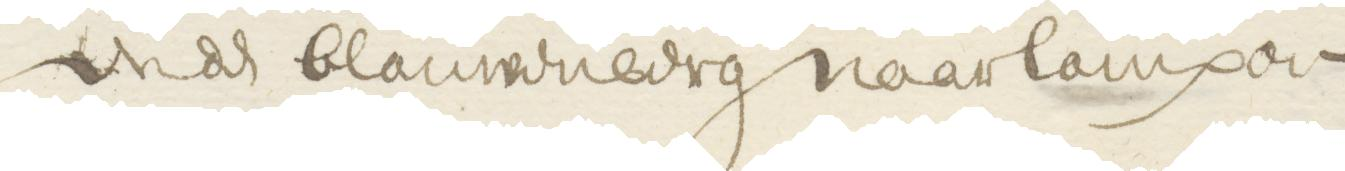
en den blauwenberg naar lampon
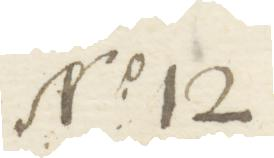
N:o 12
